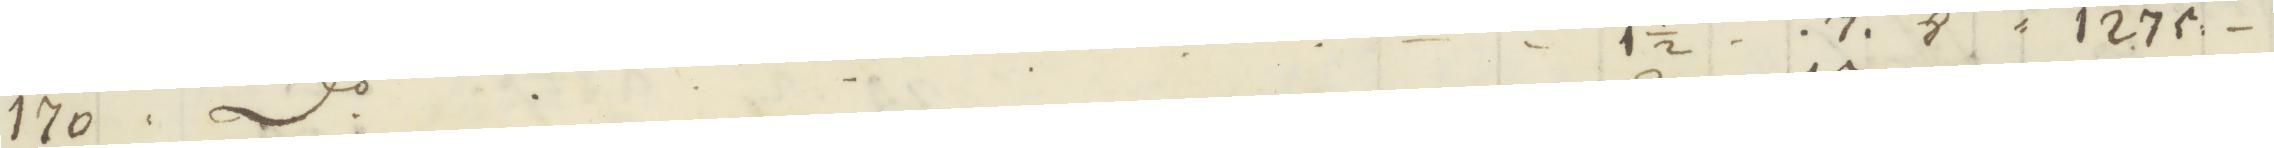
170 „ _/o . . . . . . — — 1½ — .7. 8 „ 1275: —
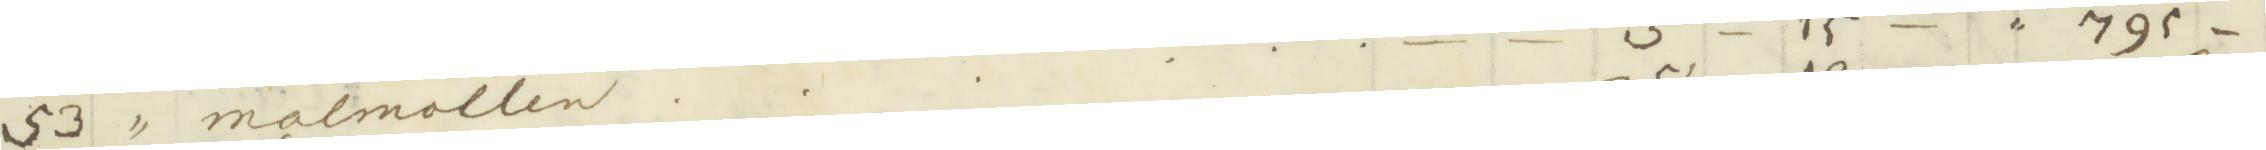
53 „ malmollen . . . . . . — — 3 — 15 — „ 795 —
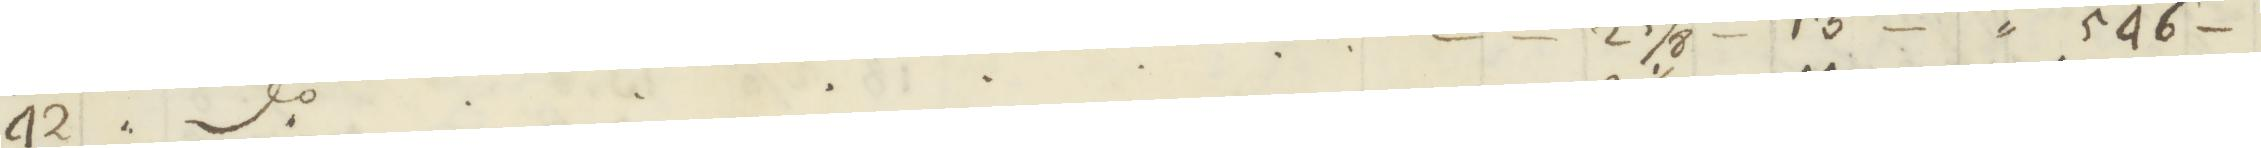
42 „ _/o . . . . . . . — — 2 5/8 — 13 — „ 546 —
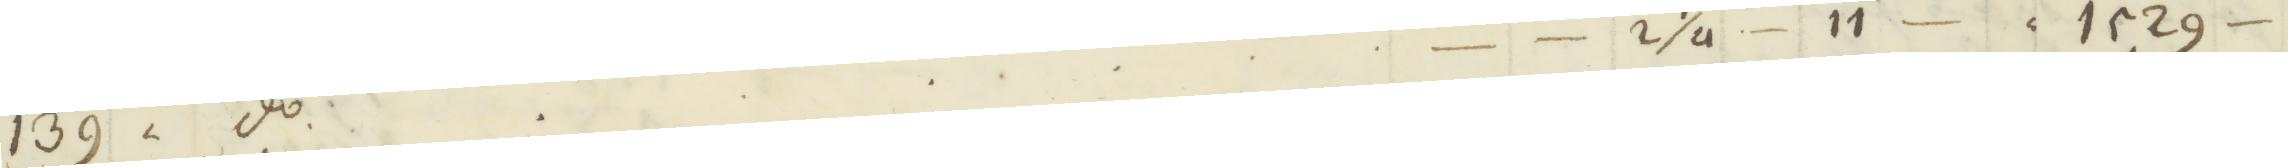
139 „ do . . . . . . — — 2¼ — 11 — „ 1529 —
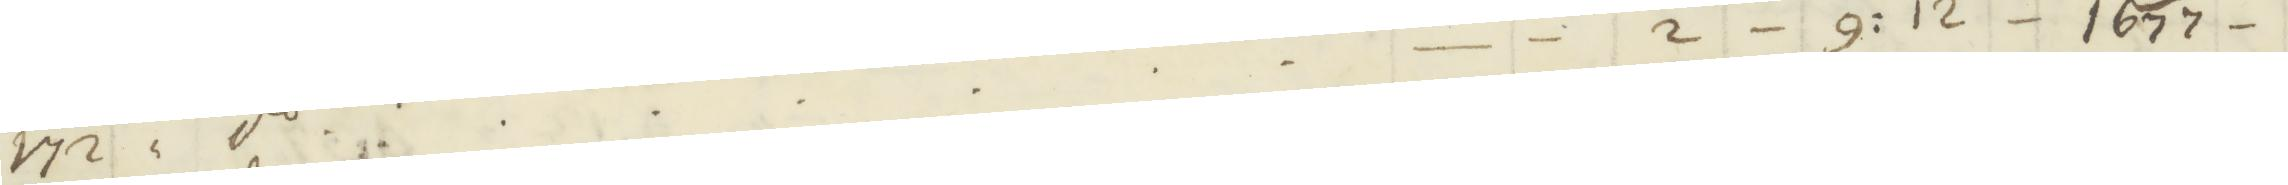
172 „ do . . . . . . . — — 2 — 9: 12 — 1677 —
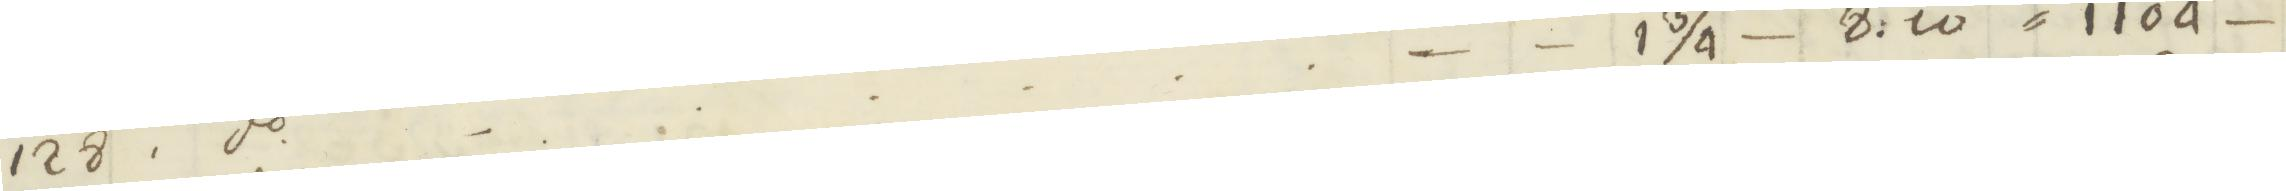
128 „ d.o . . . . . . — — 1¾ — 8: 10 „ 1104 —
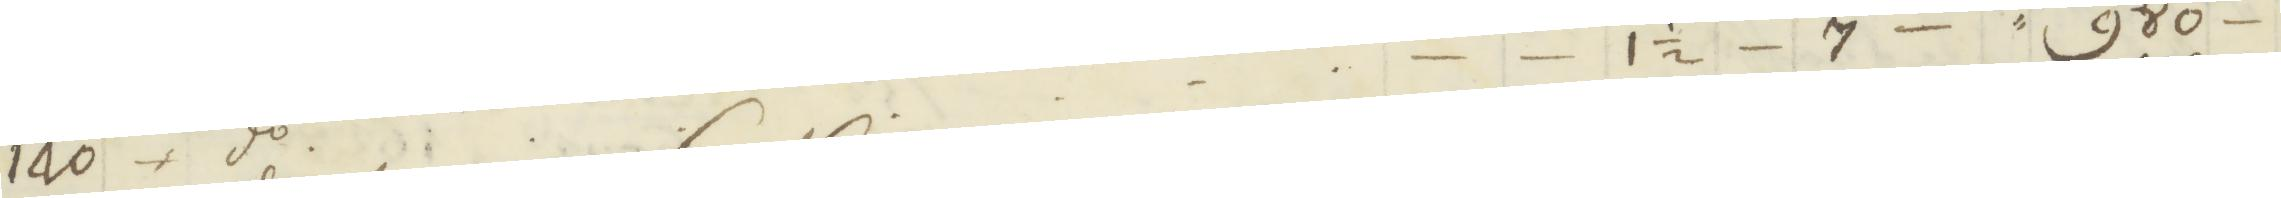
140 „ do . . . . . . . . — — 1½ — 7 — „ 980 —
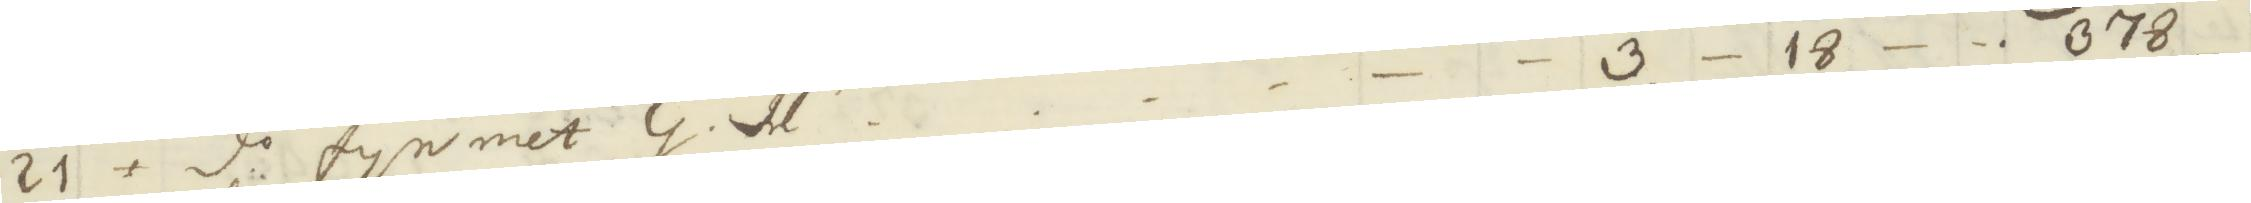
21 „ _/o fyn met G.H - - - - — — 3 — 18 - 378 —
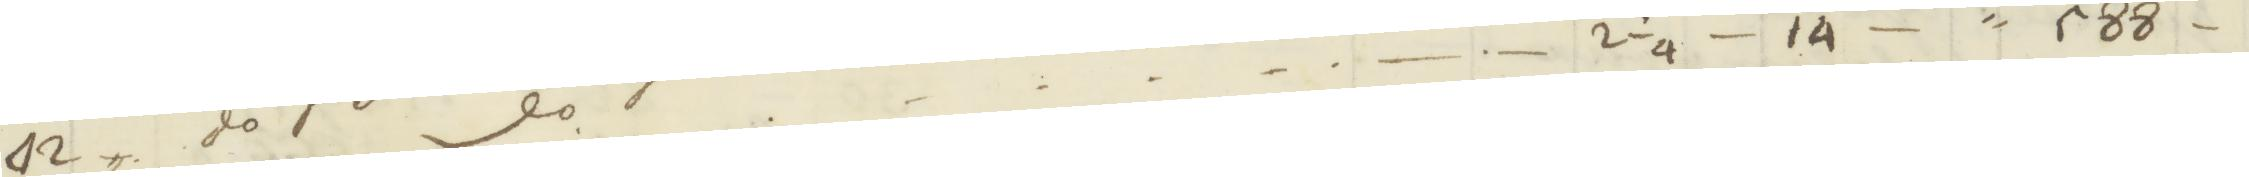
42 „ do _/o - - - - - — — 2¼ — 14 — „ 588 —
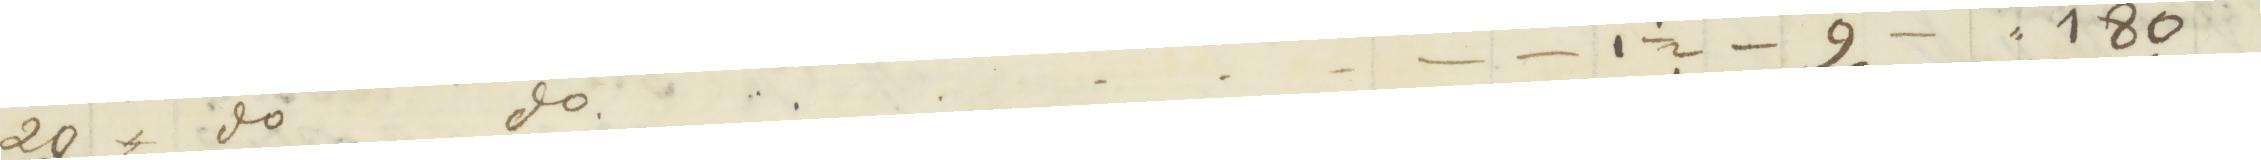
20 „ do d.o . . . . . — — 1 ½ — 9 — „ 180
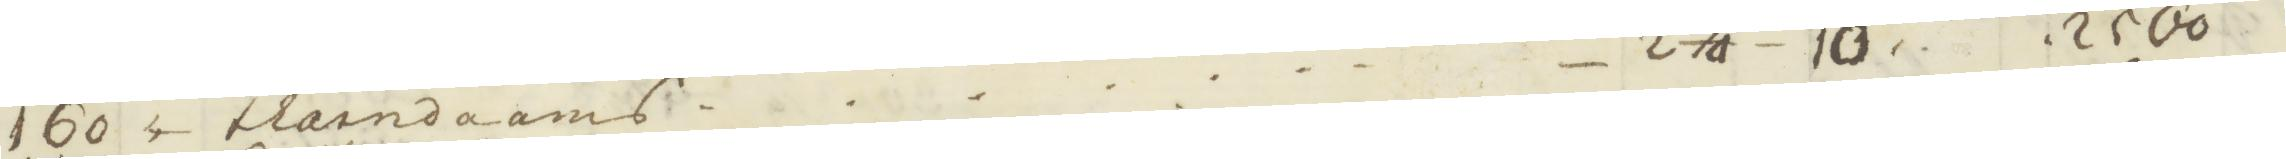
160 „ tharndaams - - - - - - - — 2¼ — 16,. „ 2560
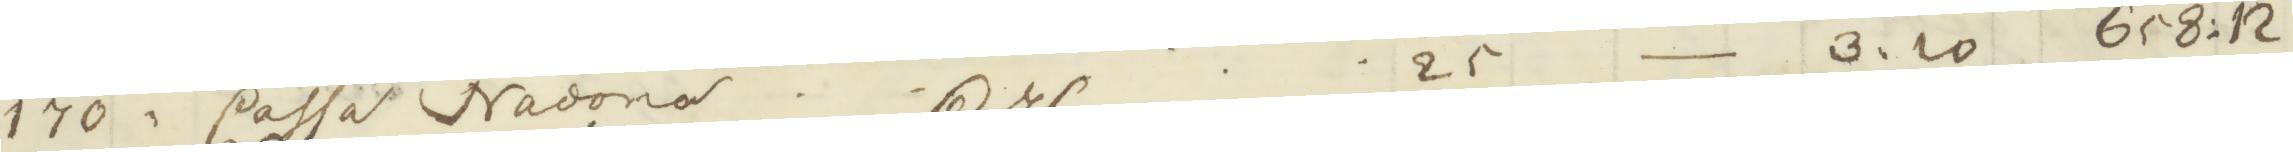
170 „ Cassa Nadona . . . . . 25 — 3„10 658:12
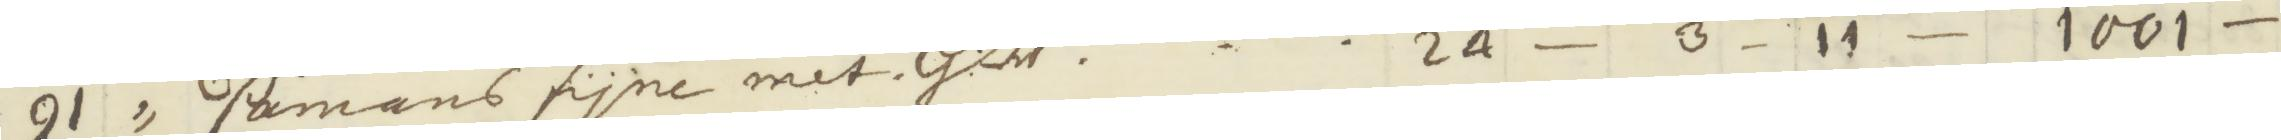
91 „ Camans fijne met G.H . . . 24 — 3 — 11 — 1001 —
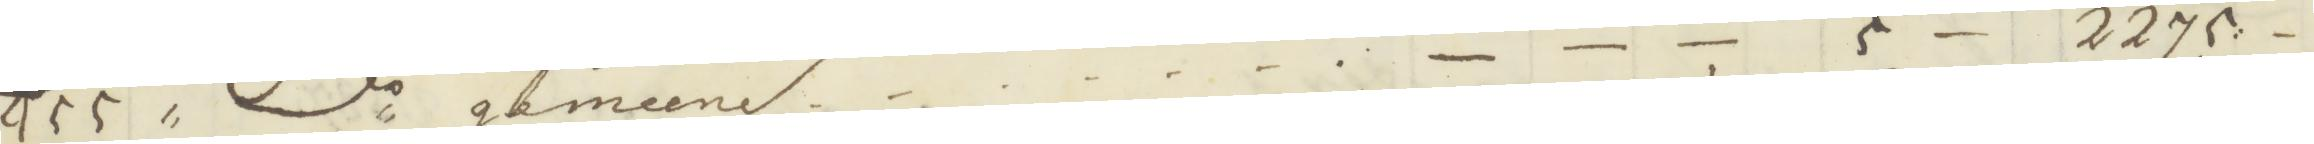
455 „ _/„o gemeene - - - - - - — — — 5 — 2275: —
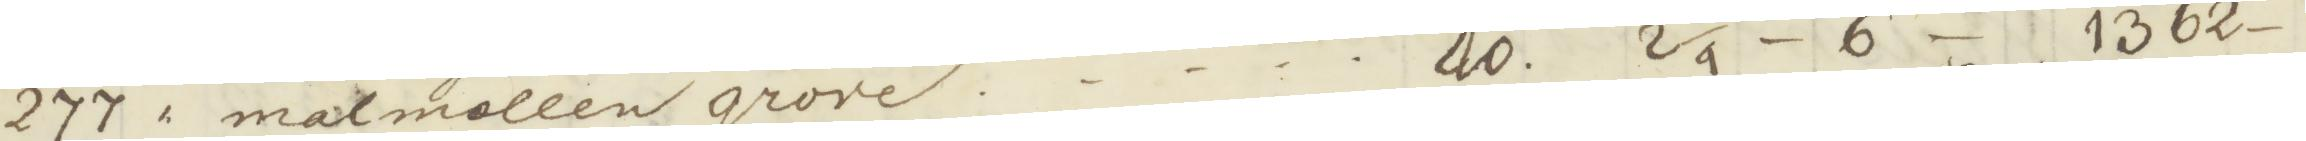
277 „ malmollen grove - - - - - 40. 2¼ — 6 — 1362—
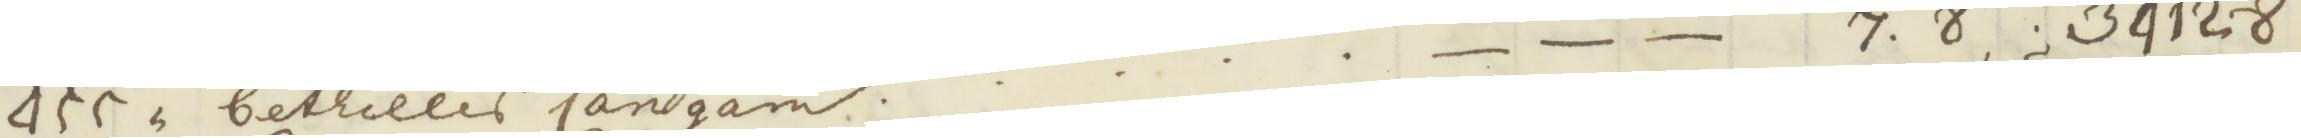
455 „ bethilles Cangam . . . . . — — — 7. 8, : 34128
